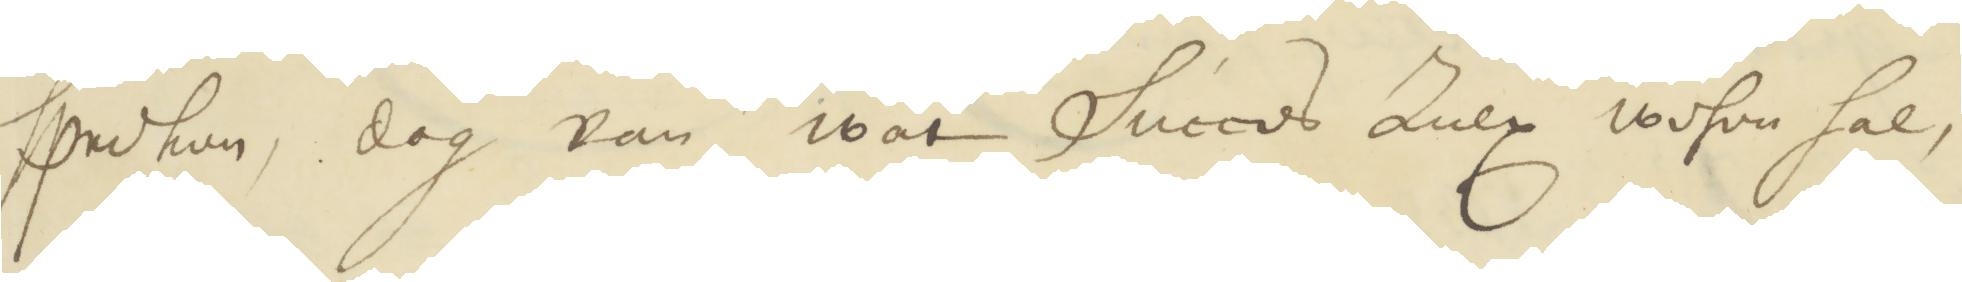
spreken, dog van wat succes zulx wesen sal,
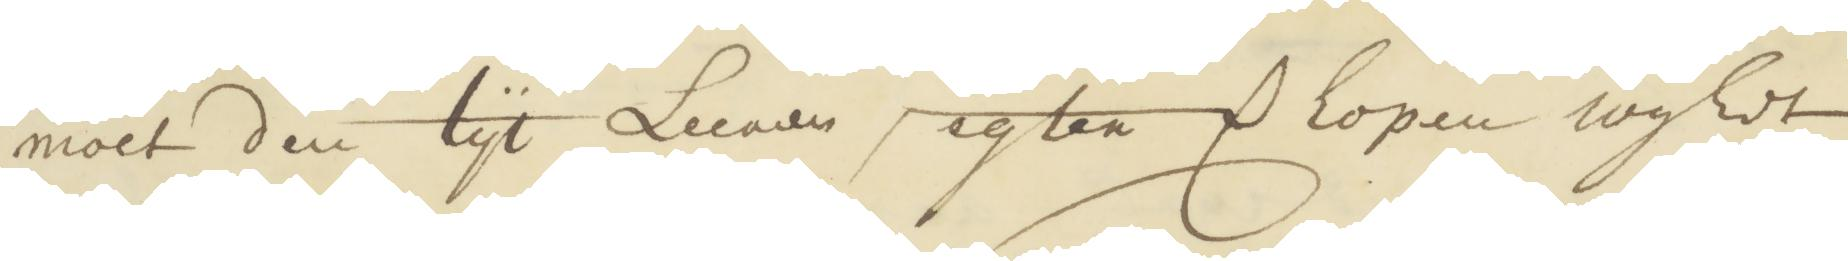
moet den tijt Leeren, egter verhopen wijhet
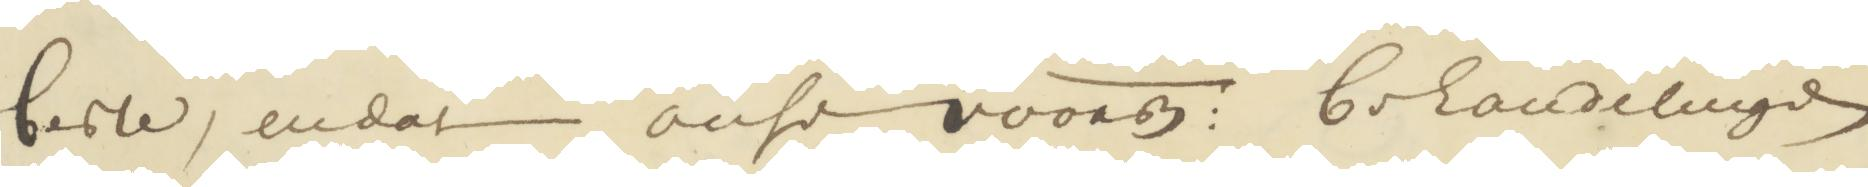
beste, endat onse voorsz: behandelingen
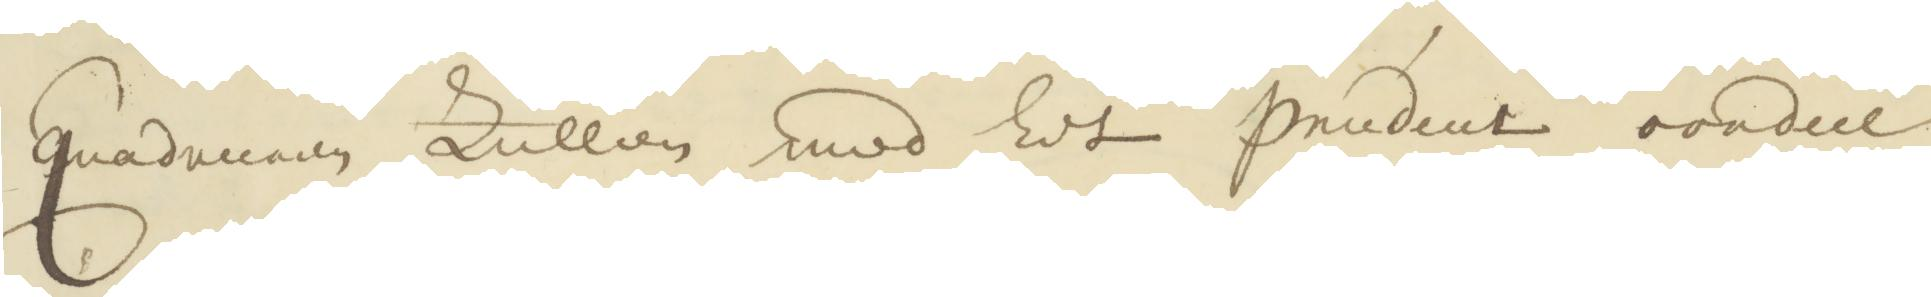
quadreeren Zullen med het prudent oordeel
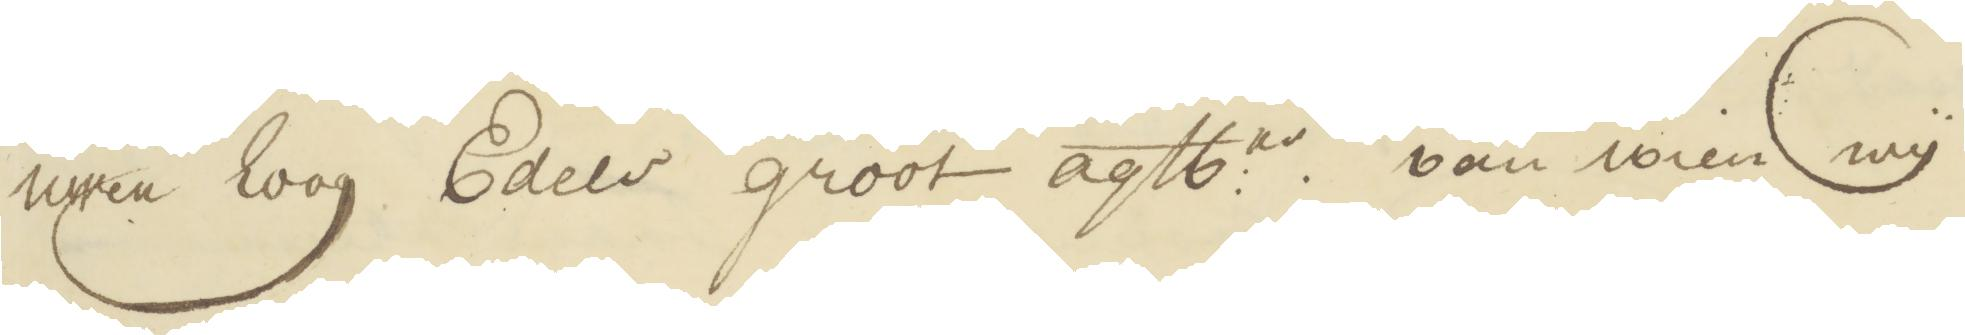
uwer hoog Edele groot agtb:rs van wien wij
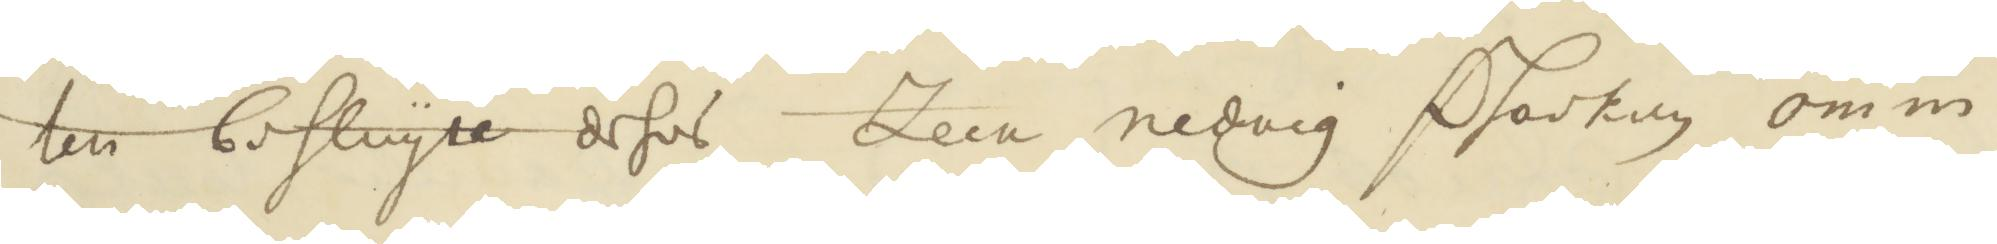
ten besluijte deses Zeer nedrig versoeken om in
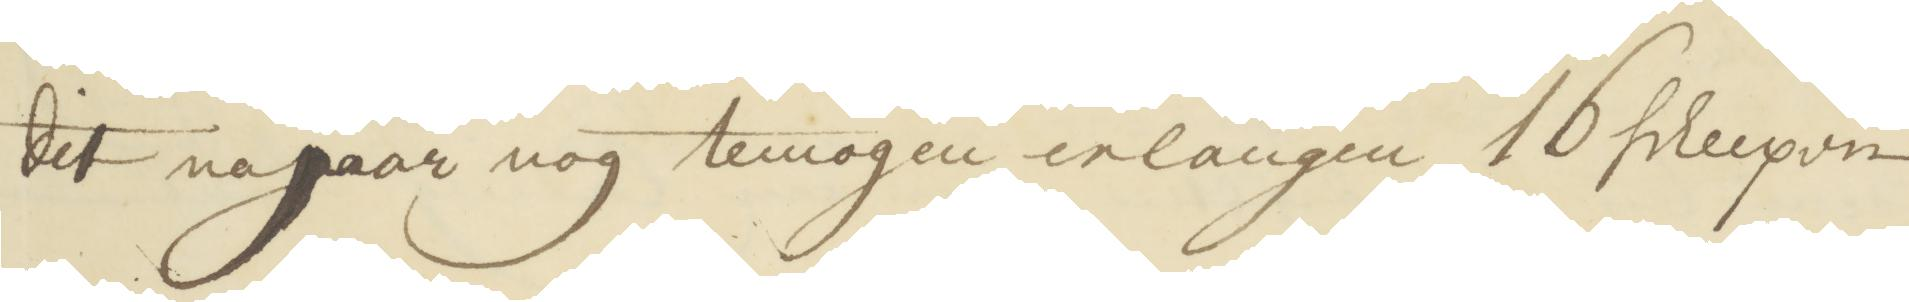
dit najaar nog temogen erlangen 16 scheepen
